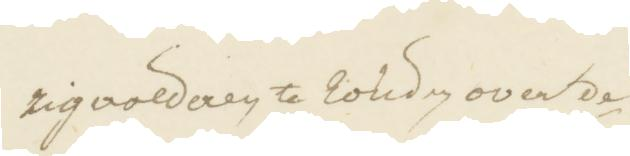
zig voldaen, te houden over de
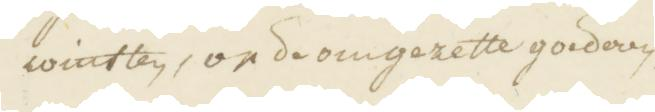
winsten, op de omgezette goederen
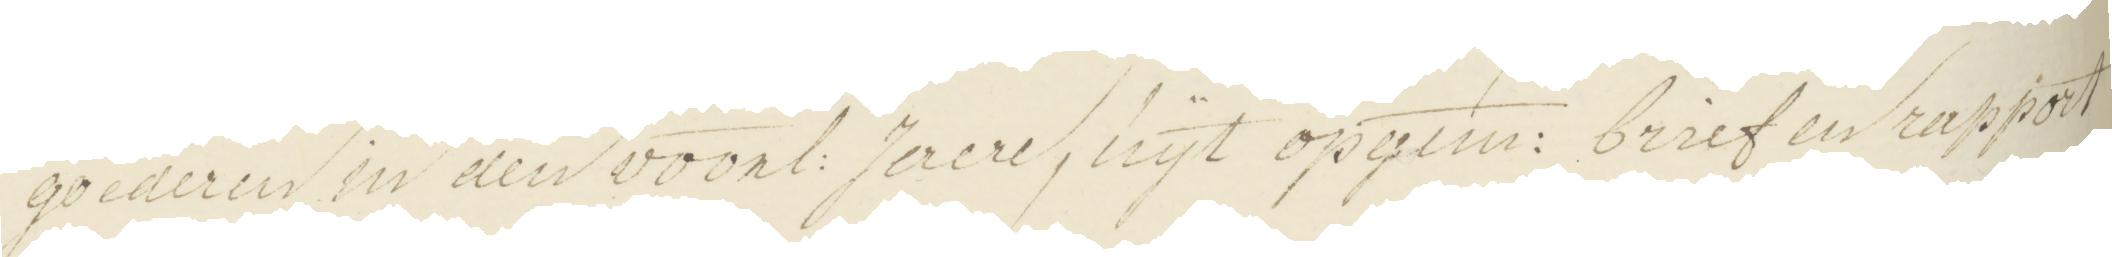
goederen in den voorl: Jaere, uijt opgem: brief en rapport
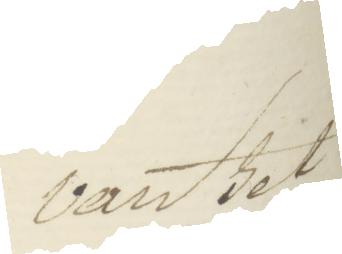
van het
